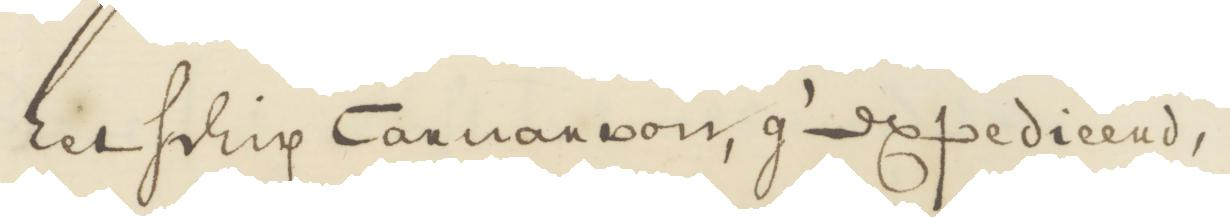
het schip Carnarvon, g’expedieerd,
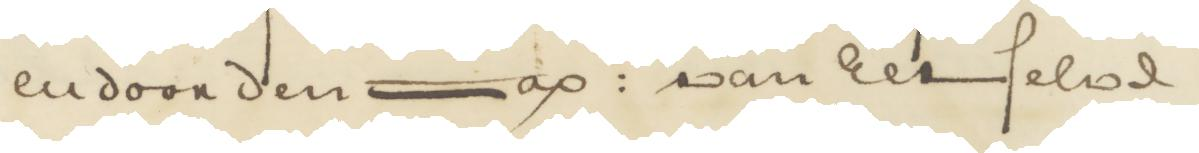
en door den cap:n van het selve
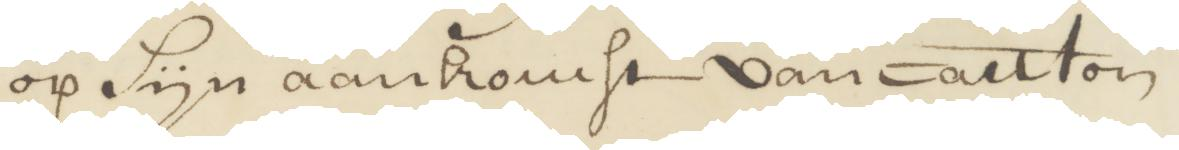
op sijn aankomst van carlton
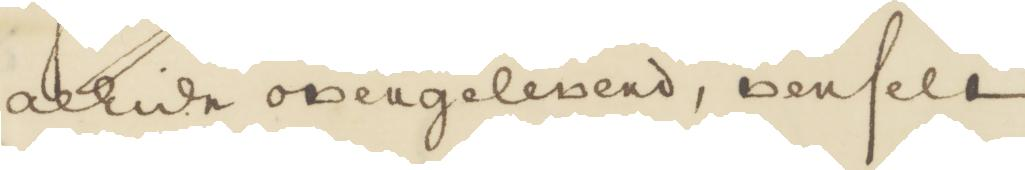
alhier overgeleverd, verselt
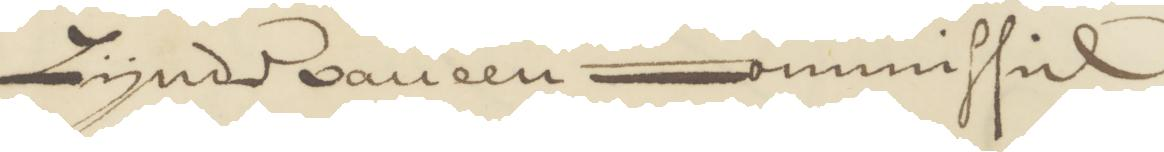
Zijnde van een commissie
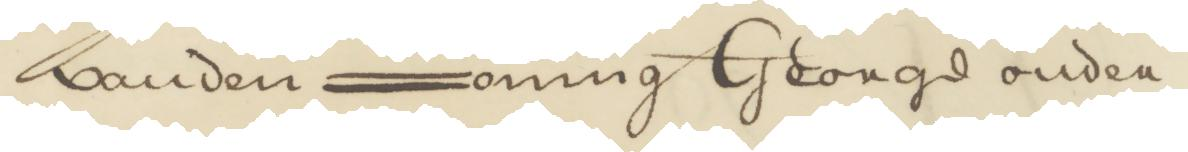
van den coning George onder
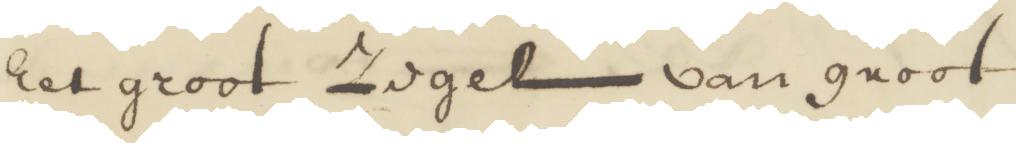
het groot Zegel van groot
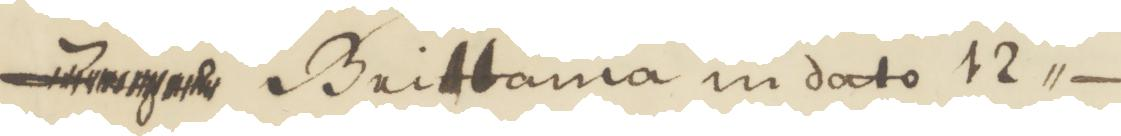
Zegel Brittania in dato 12„n
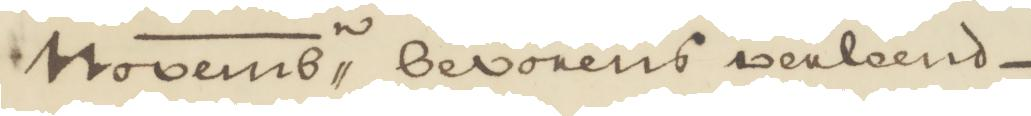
Novemb„r bevorens verleend
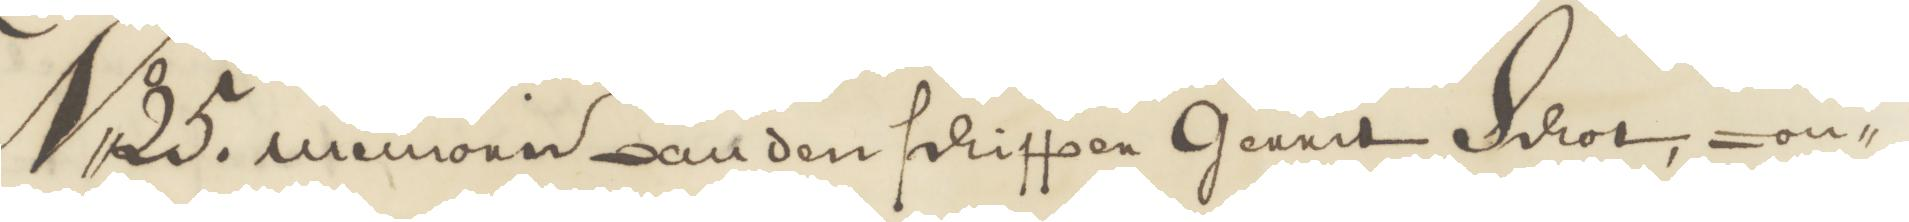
N„o 25. memorie van den schipper Gerrit Schot, con„
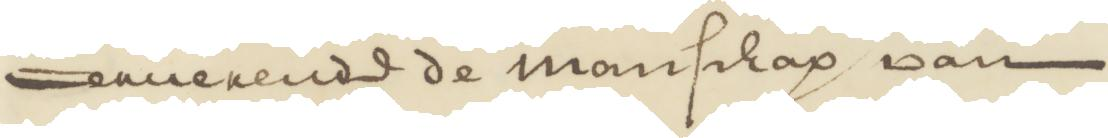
cernerende de manschap van
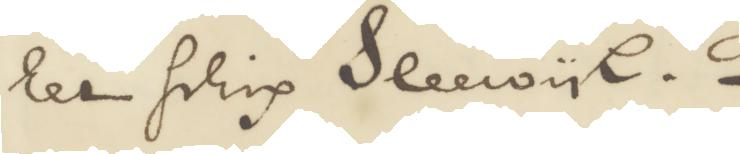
het schip Sleewijk.
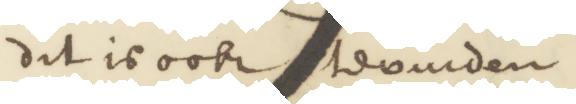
dit is ook tevinden
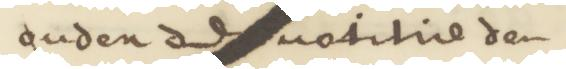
onder de notitie den
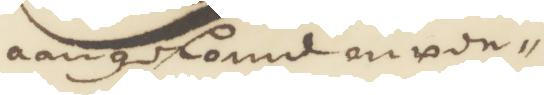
aangekome en ver„
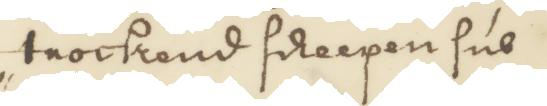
„trockene scheepen sub
